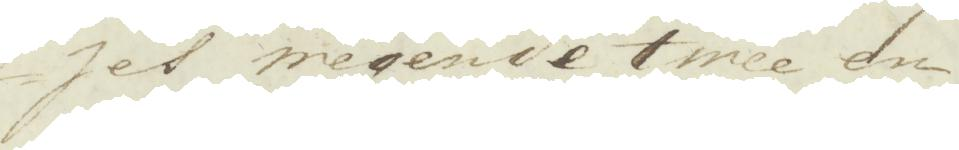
=jes wegende twee en
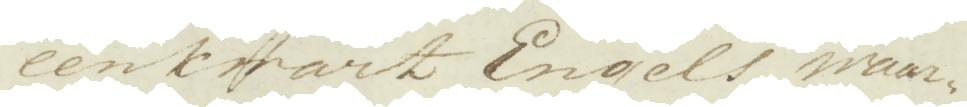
een kwart Engels, waar„
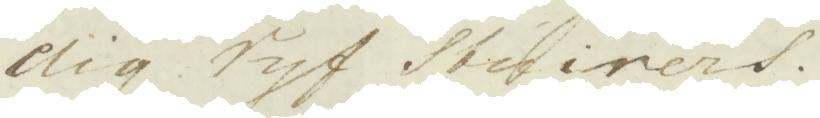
dig Vyf stuivers.
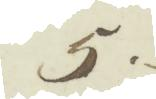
5 .
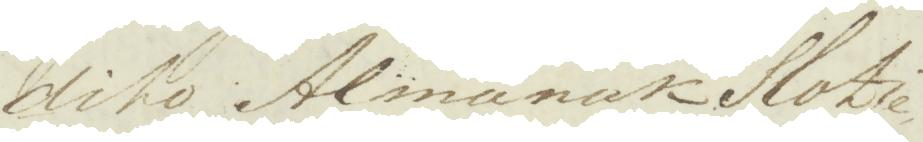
dito Almanak Slotje,
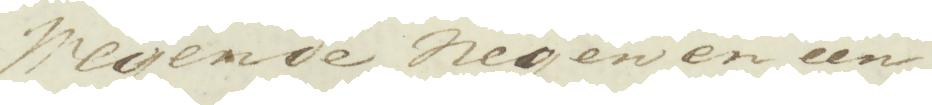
wegende negen en een
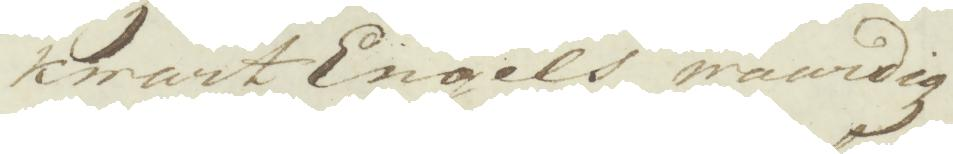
kwart Engels, waardig
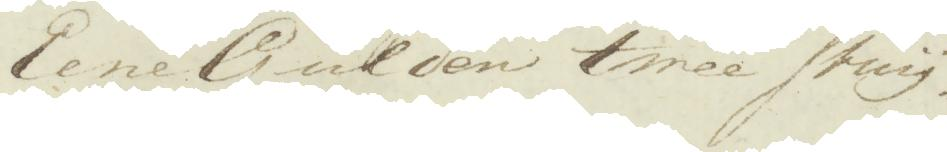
Eene Gulden twee stuij
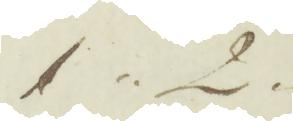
1 „ 2 .
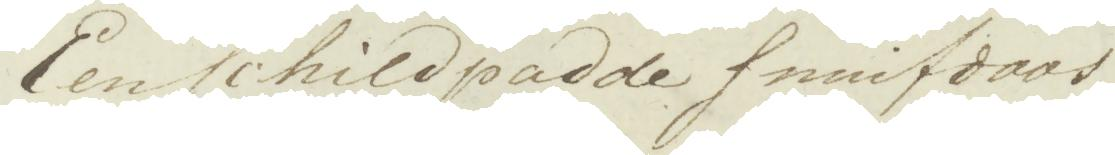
Een schildpadde snuifdoos
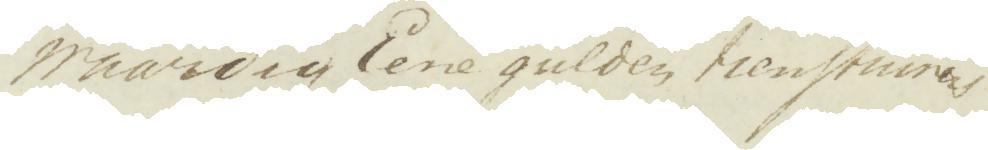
Waardig Eene gulden tien stuivers
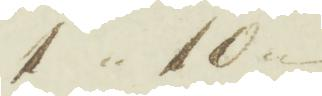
1 „ 10 „
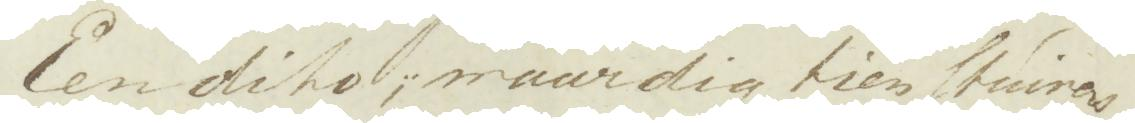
Een dito; waardig tien stuivers
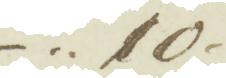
- .. 10 .
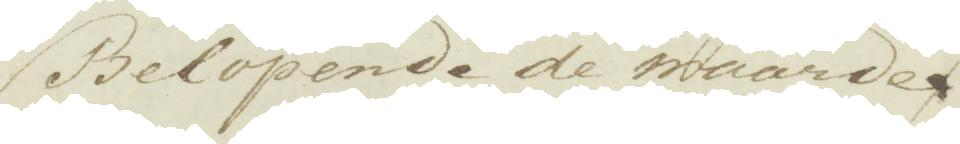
Belopende de waarde ƒ
